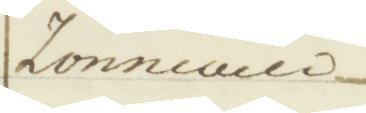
Zonneveld
